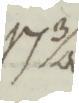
17¾
